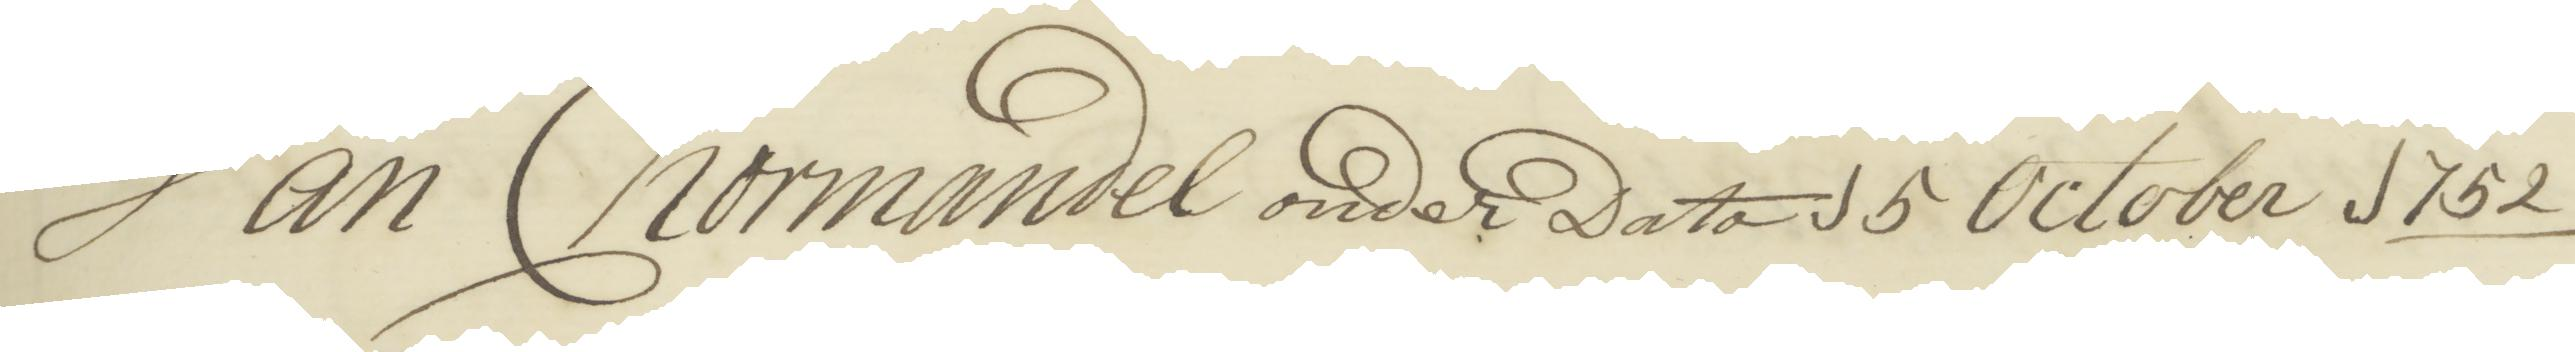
Van Chormandel onder Dato 15 October 1752
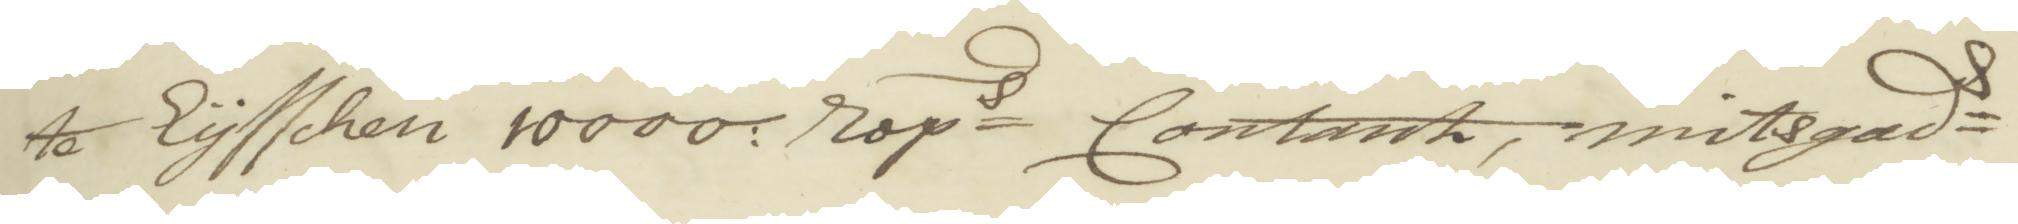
te Eijsschen 10000: rop=s Contant, mitsgad=s
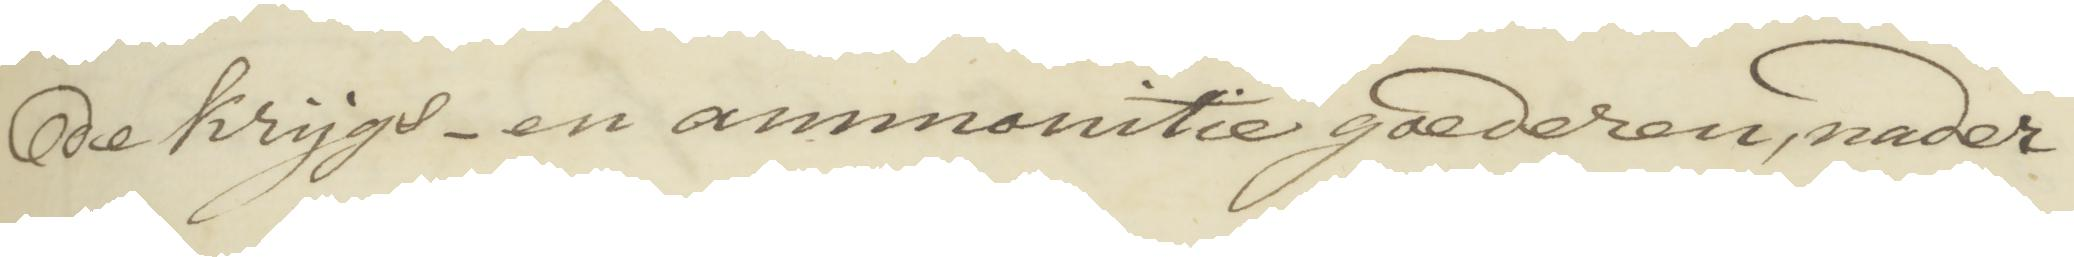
de krijgs-en ammonitie goederen, nader
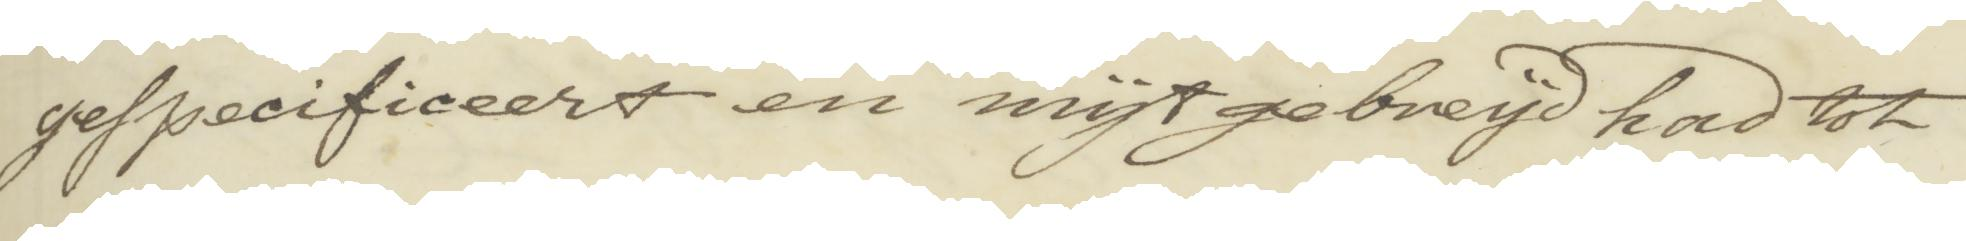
gespecificeert en uijt gebreijd had tot
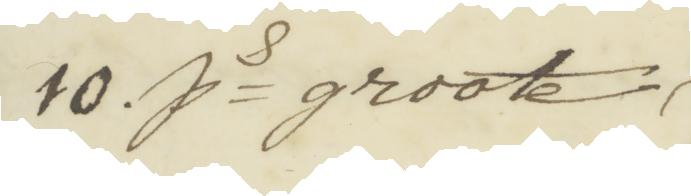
10. p=s groote
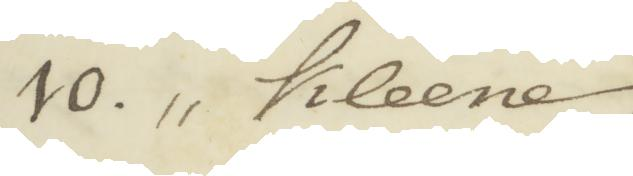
10. „ kleene
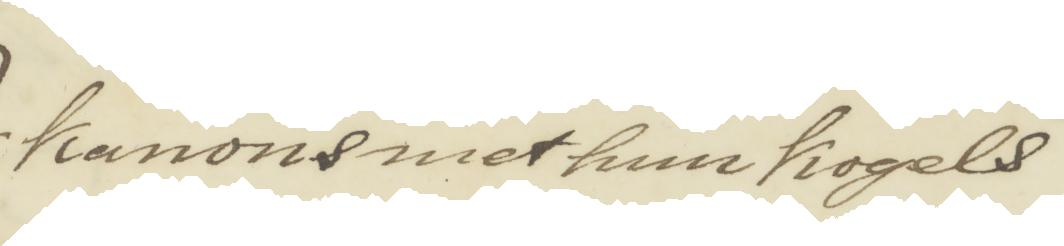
kanons met hun kogels
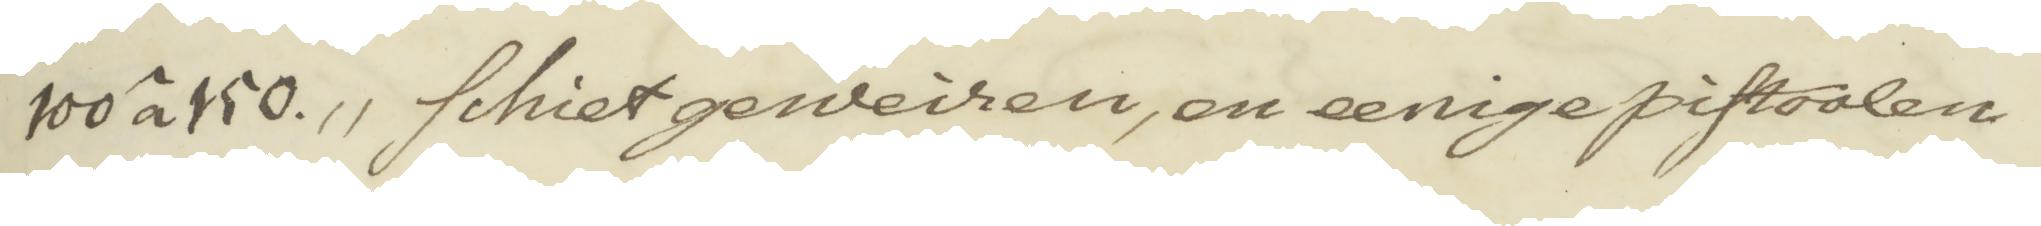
100 â 150. „ schietgeweiren, en eenige pistoolen
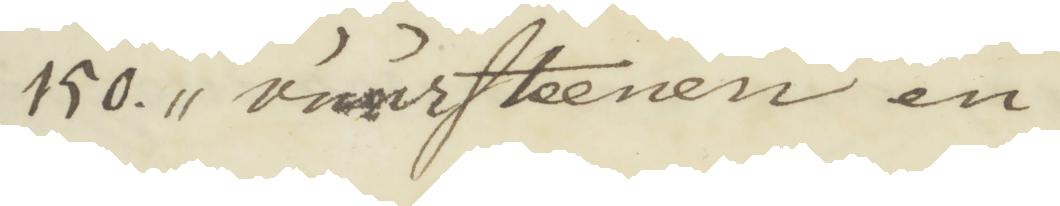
150. „ vuursteenen en
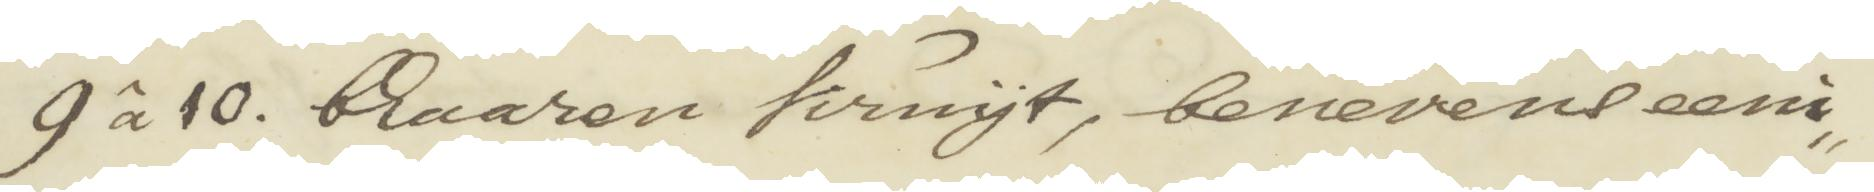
9 â 10. bhaaren kruijt, benevens eeni„
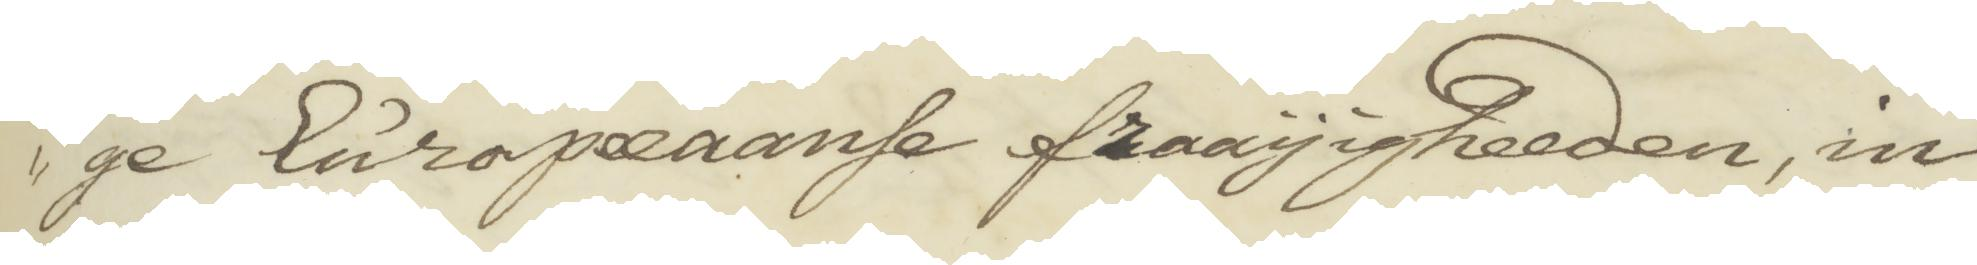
„ge Europeeaanse fraaijigheeden, in
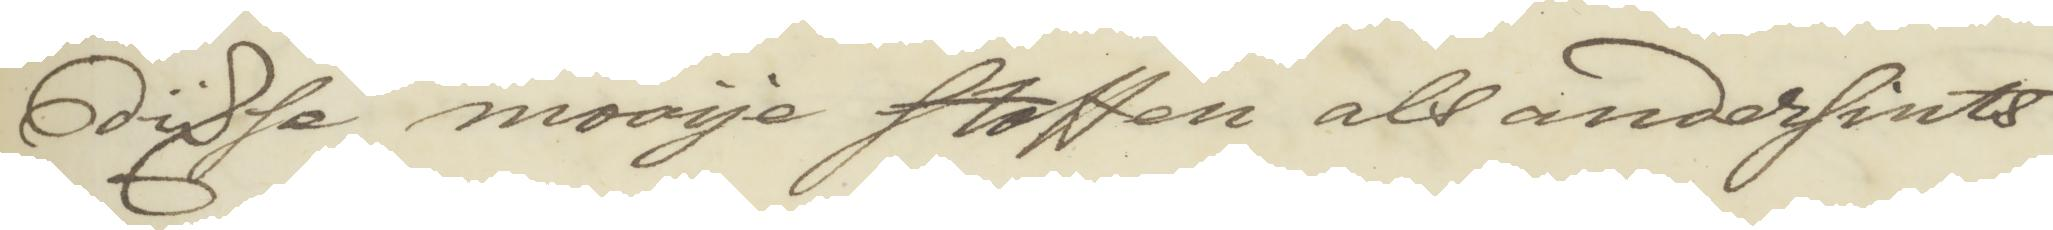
diverse mooije stoffen als andersints
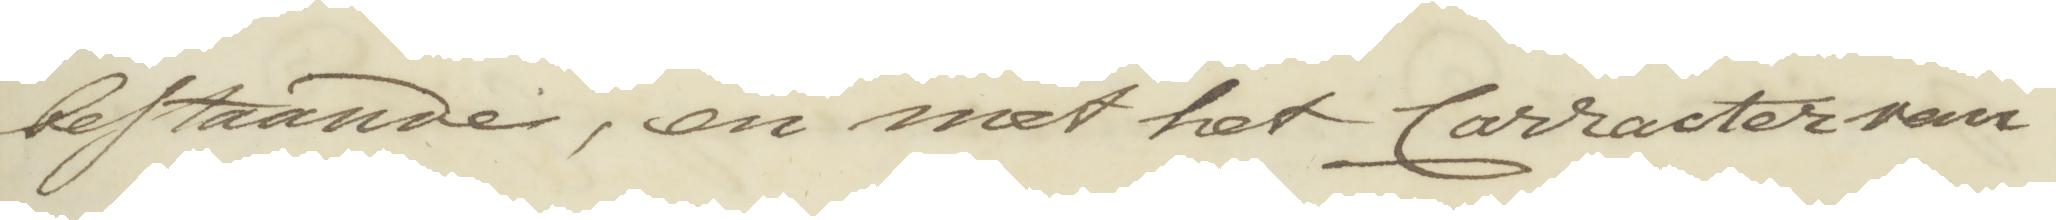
bestaande, en met het Carracter van
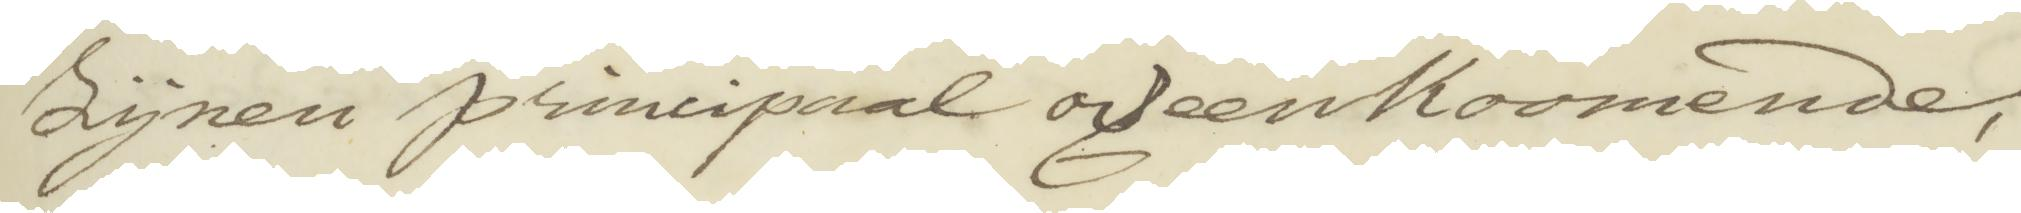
zijnen principaal overeenkoomende,
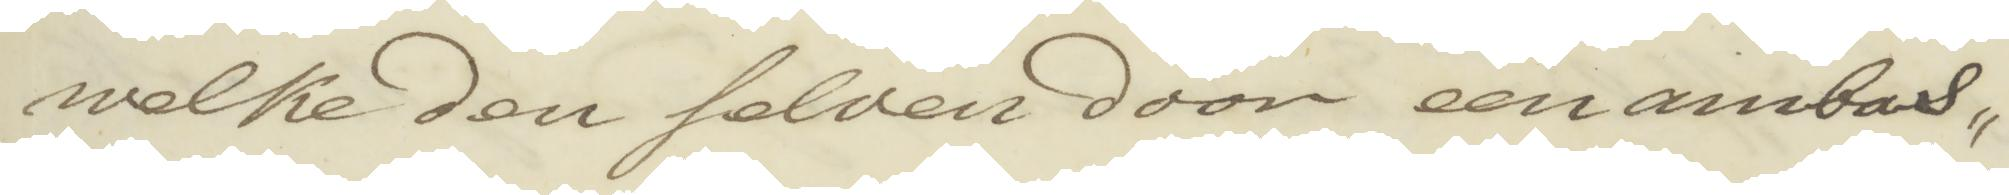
welke den selven door een ambas„
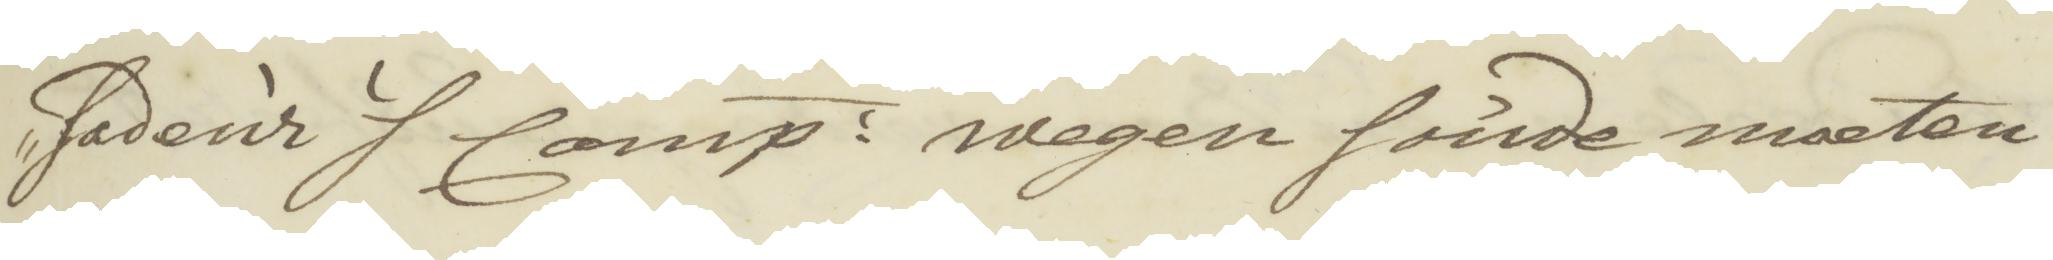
„sadeur ’s Comp: wegen soude moeten
